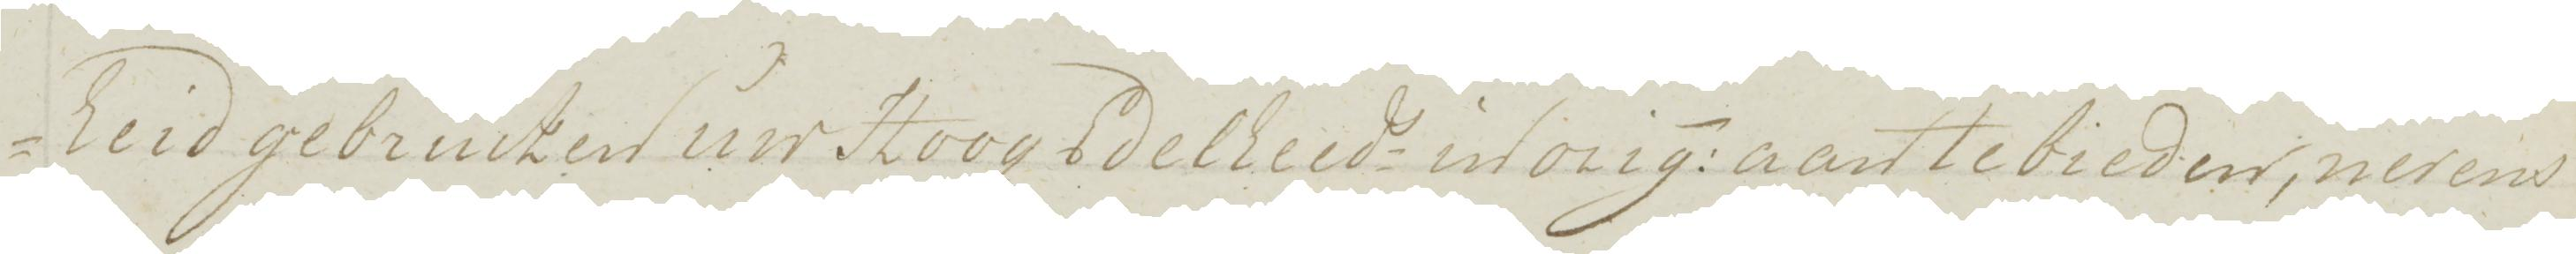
=heid gebruiken uw Hoog Edelheed=s in orig: aan te bieden, nevens
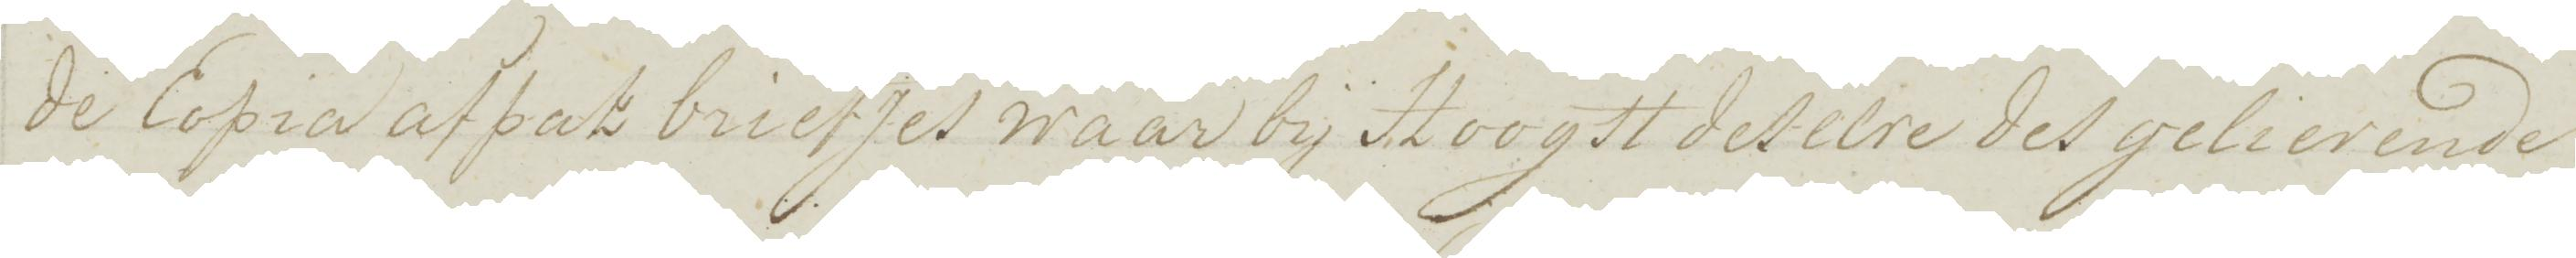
de Copia afpakbriefjes waar bij Hoogst deselve des gelievende
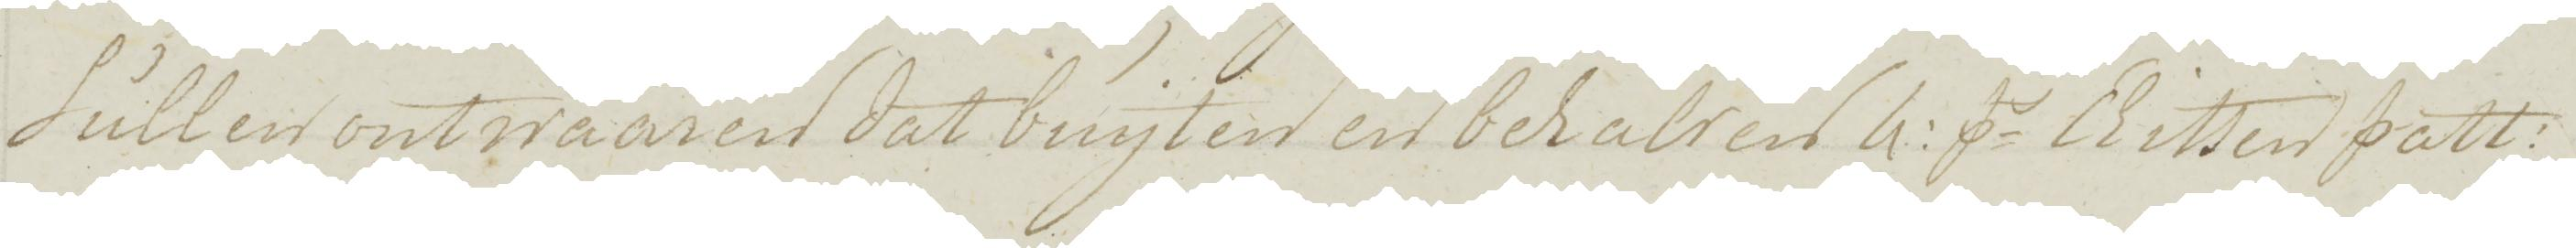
sullen ontwaaren dat buijten en behalven 4: p=s Chitsen patt:
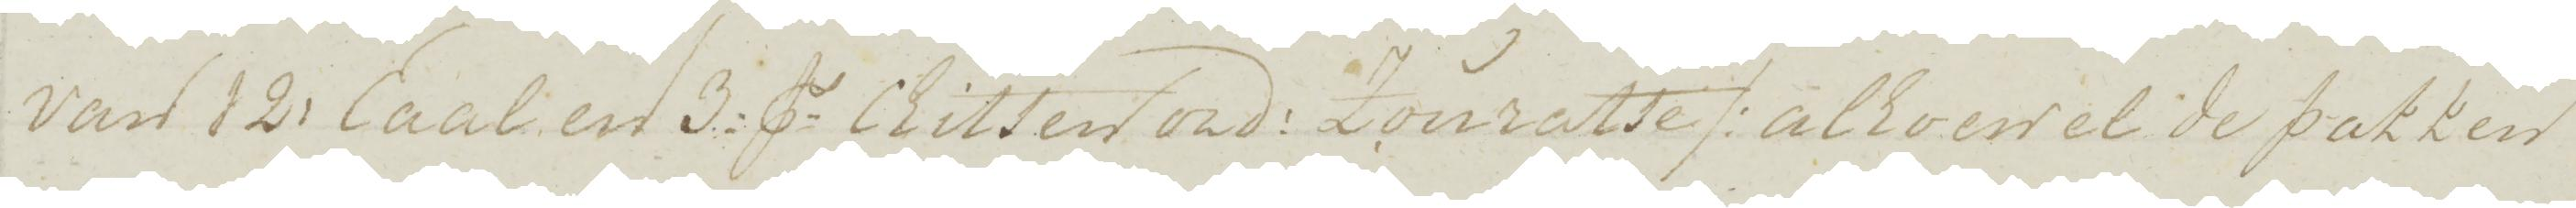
van 12: Caal: en 3: p=s chitsen ord: Zouratse /: alhoewel de pakken
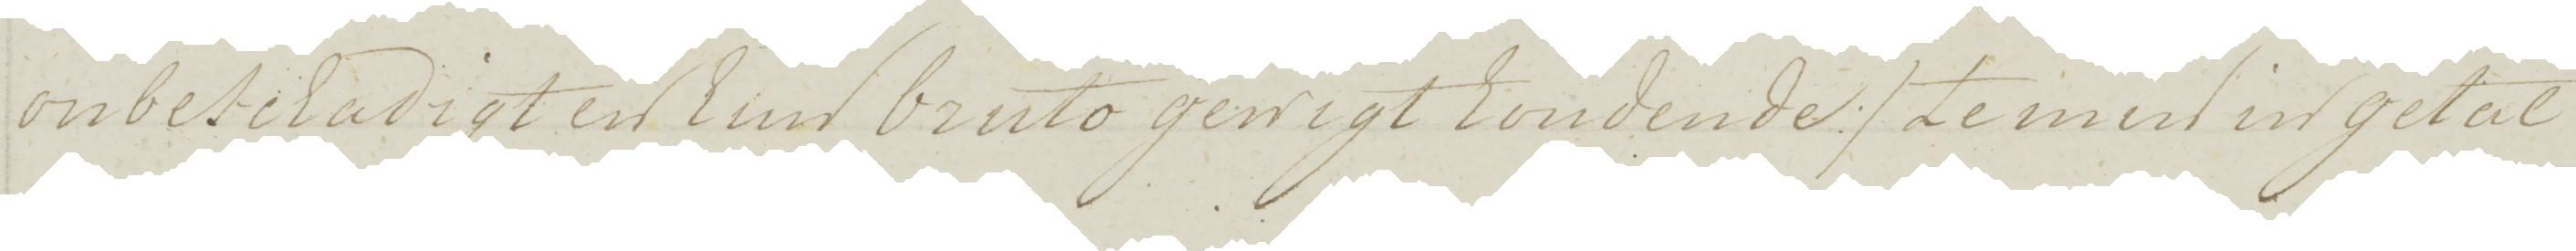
onbeschadigt en hun bruto gewigt houdende:/ te min in getal
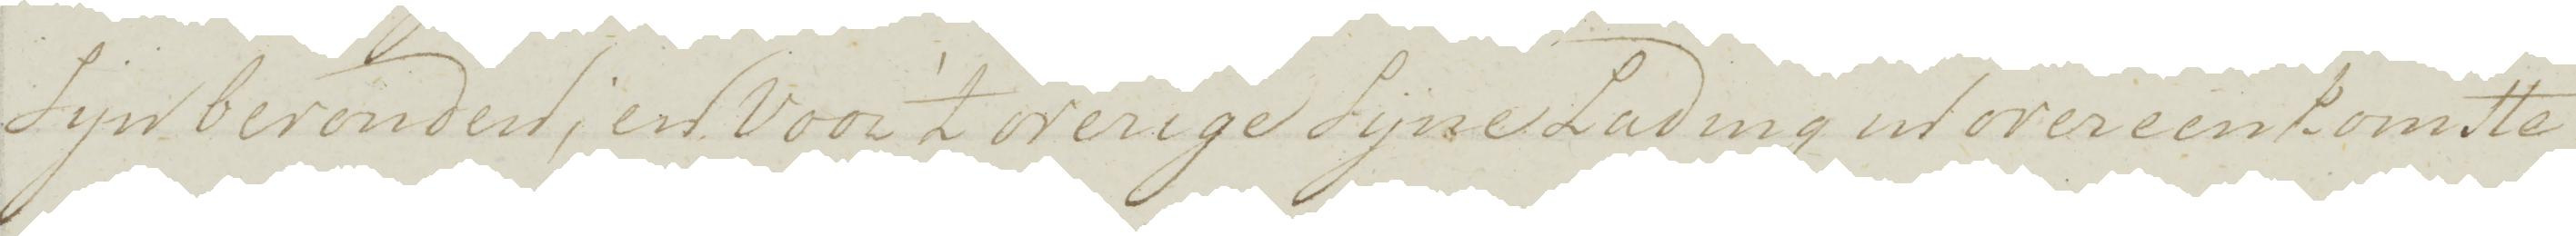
sijn bevonden, en voor 't overige sijne Lading in overeenkomste
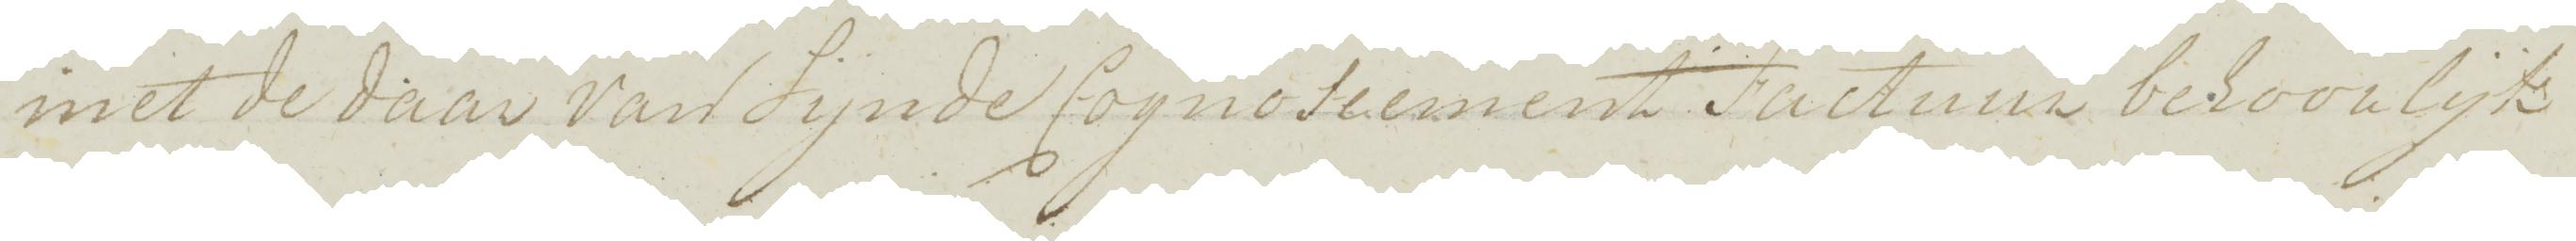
met de daar van sijnde cognossement Factuur behoorlijk
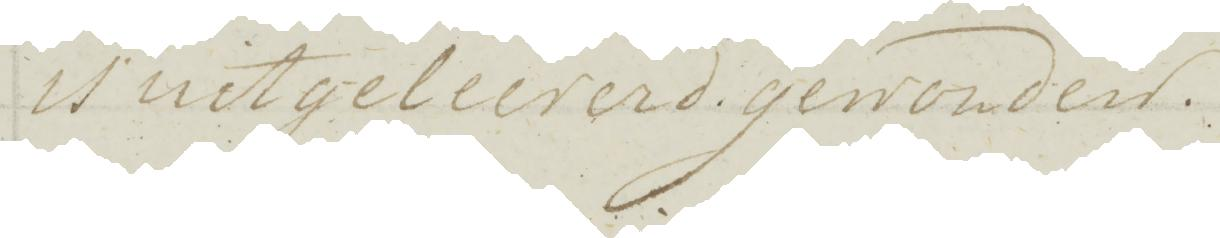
is uitgeleeverd gewonden.
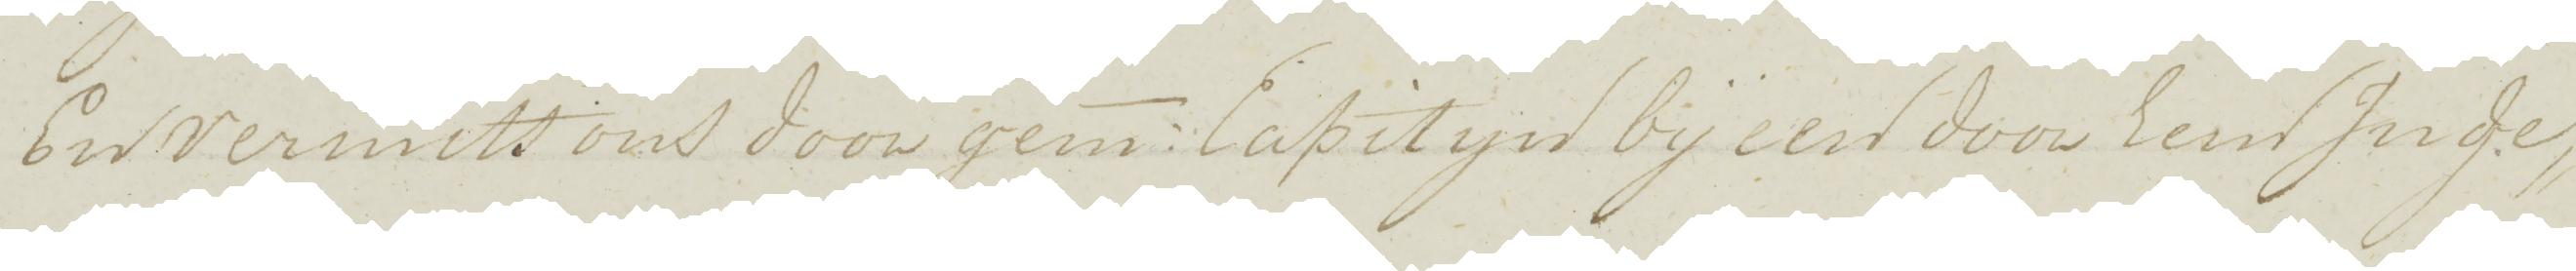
En vermits ons door gem: Capitijn bij een door hem Jnge„
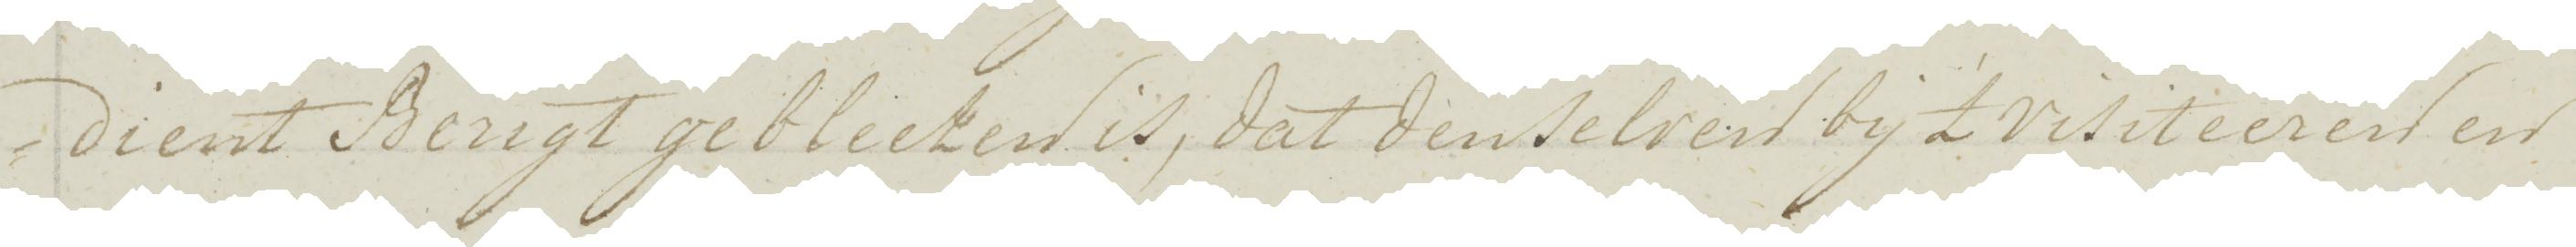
„dient Berigt gebleeken is, dat denselven bij 't visiteeren en
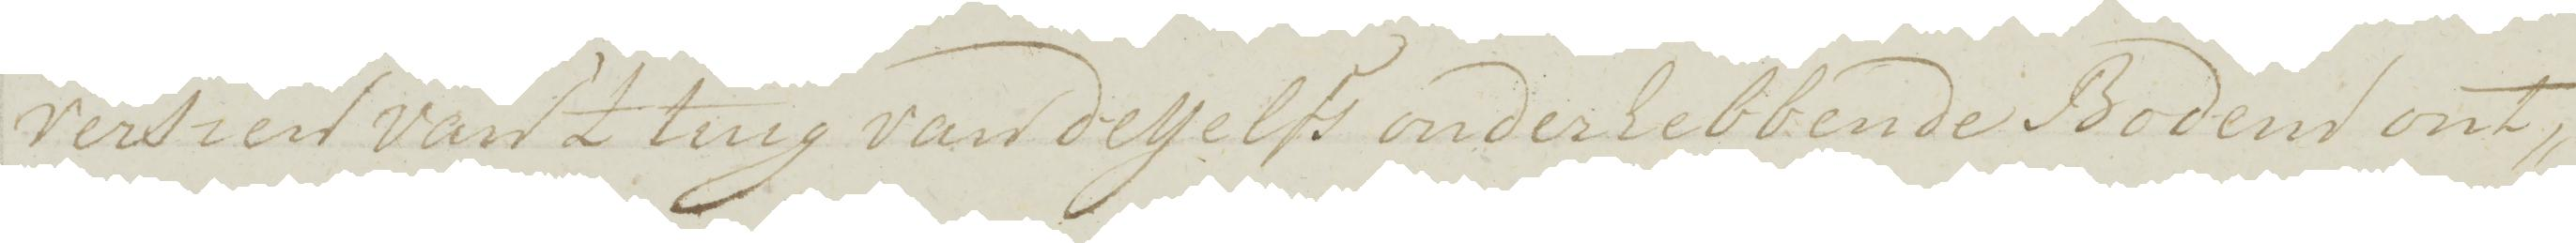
versien van 't tuig van desselfs onderhebbende Bodem ont„
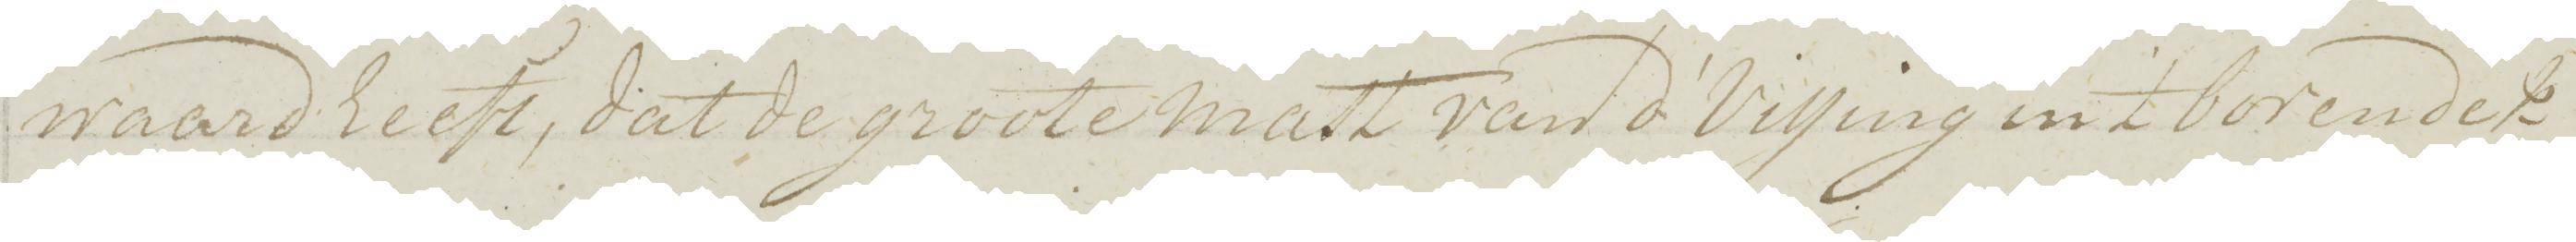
waard heeft, dat de groote mast van d’vissing in ’t bovendek
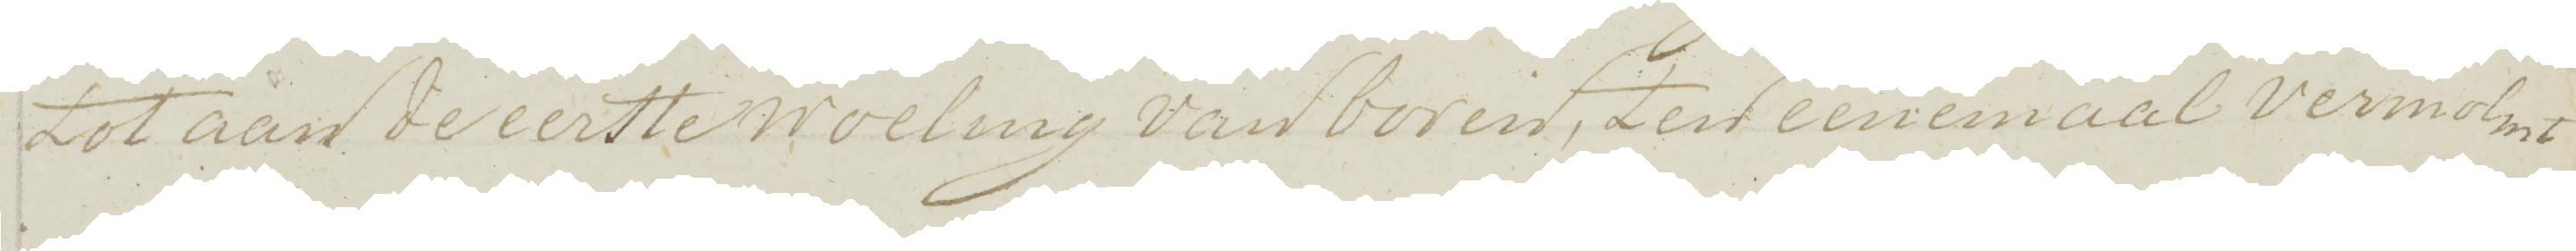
tot aan de eerste woeling van boven, ten eenemaal vermolmt
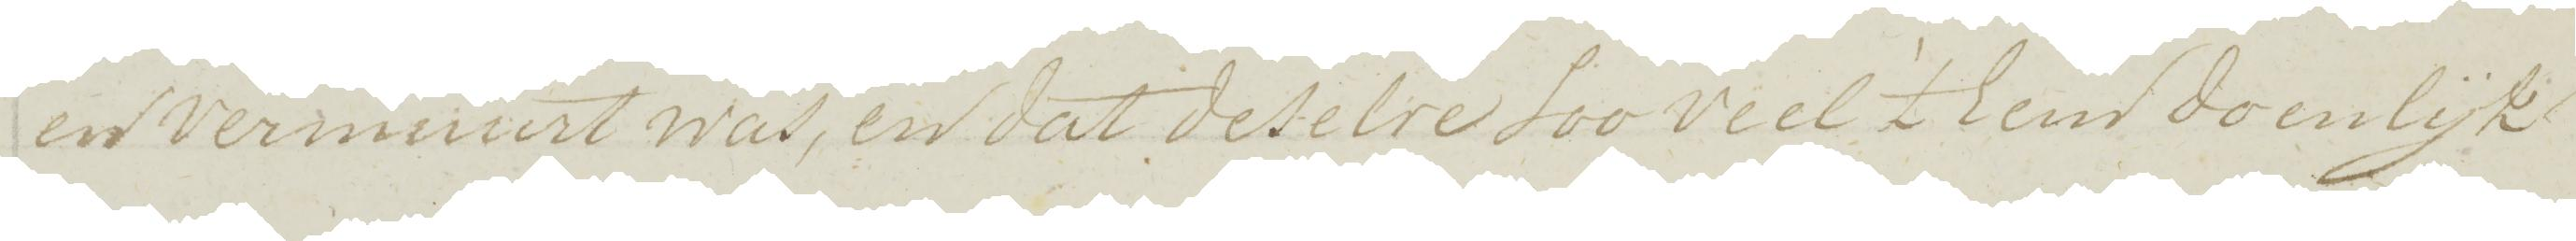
en vermuurt was, en dat deselve soo veel ’t hem doenlijk
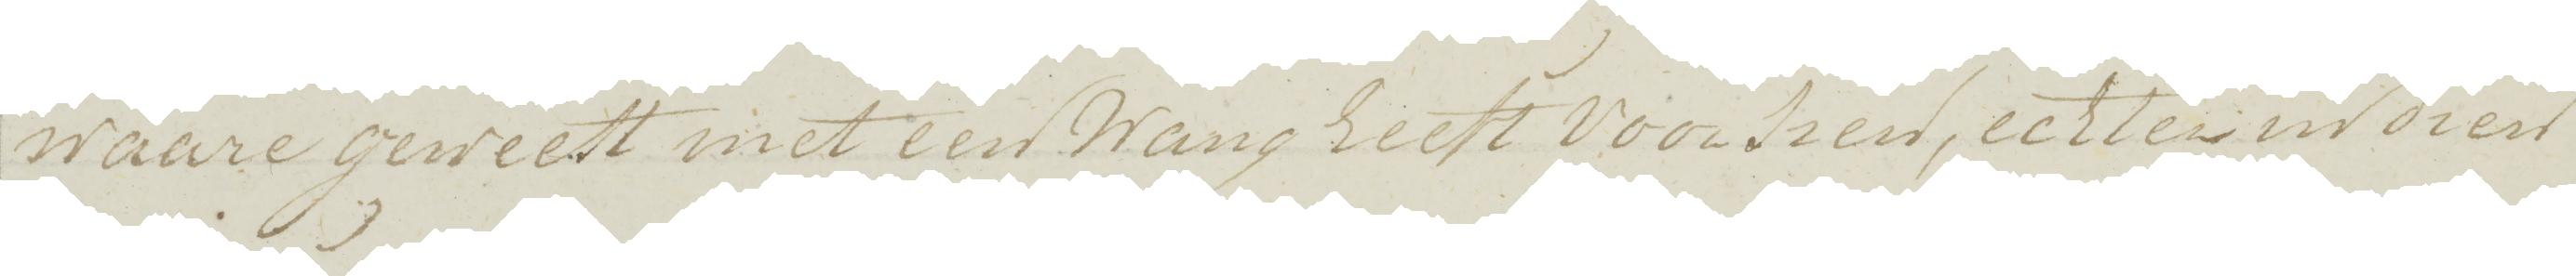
waare geweest met een wang heeft voorsien, echter in dien
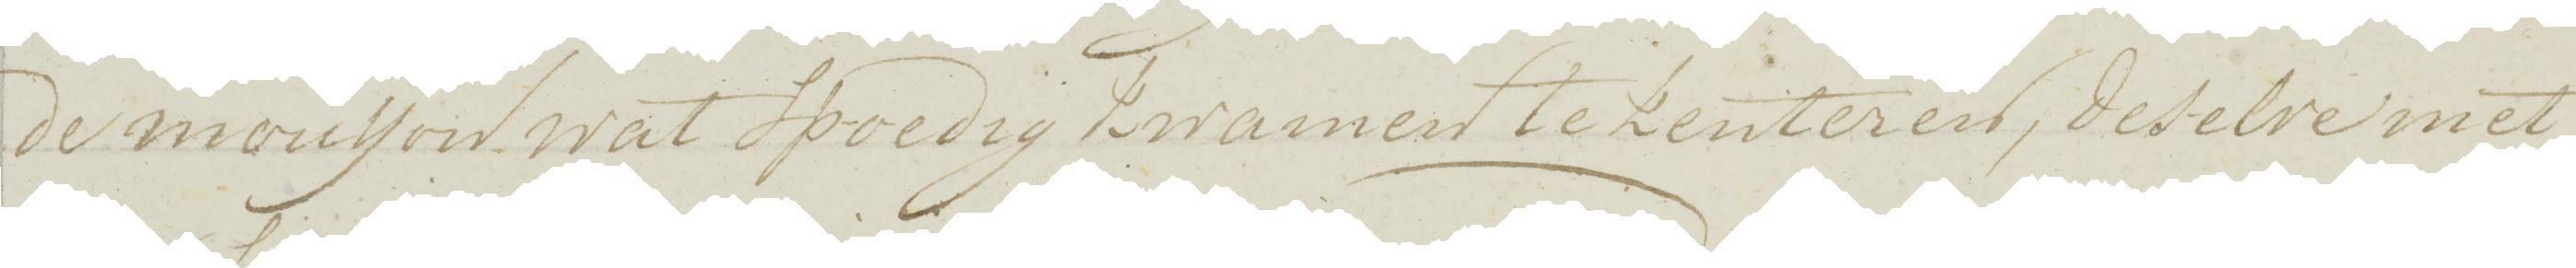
de mousson wat spoedig kwamen te kenteren, deselve met
